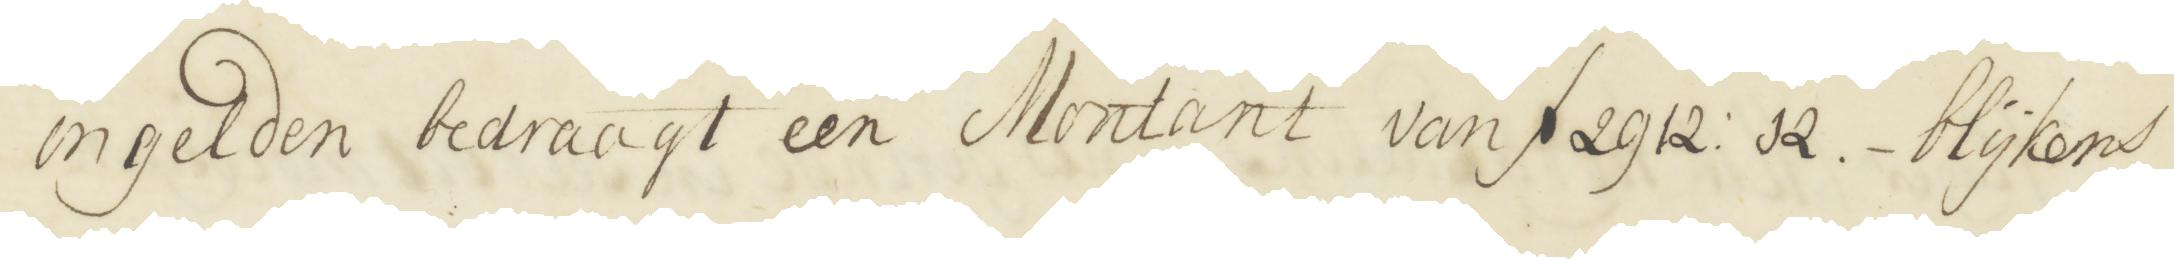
ongelden bedraagt een Montant van ƒ2912: 12. – blijkens
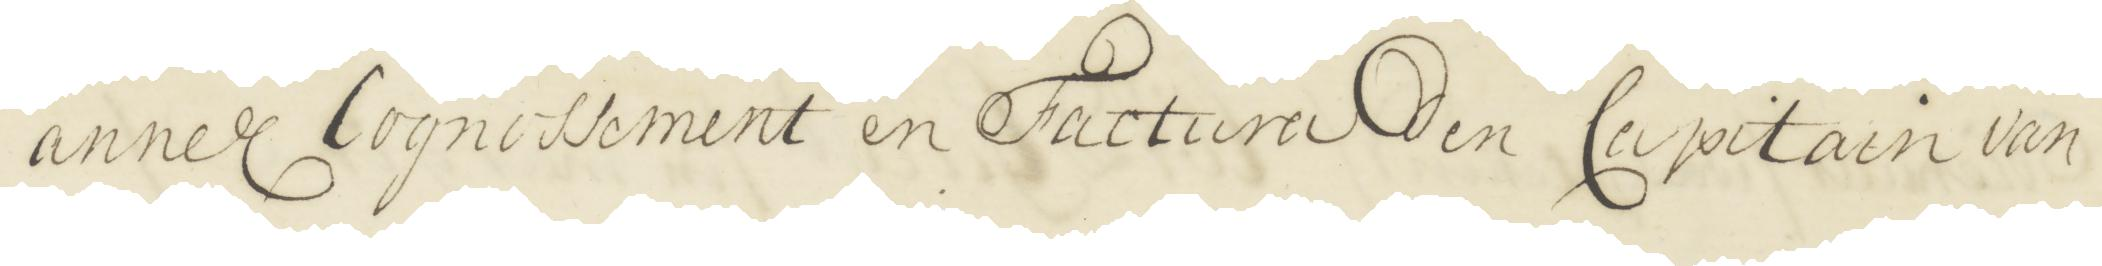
annex Cognossement en Factura den Capitain van
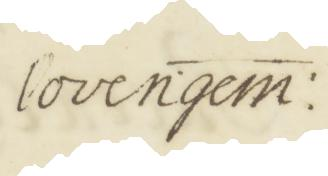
bovengem:
